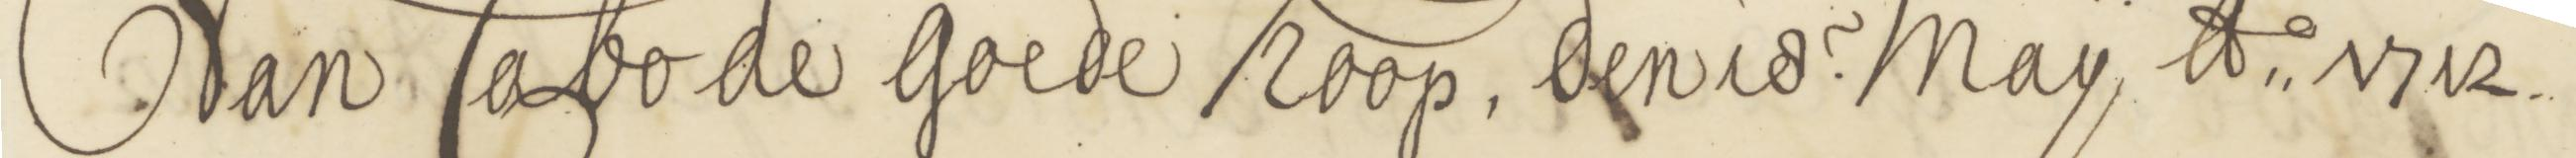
Van Cabo de goede hoop, den 18.' Maij a„o 1712..
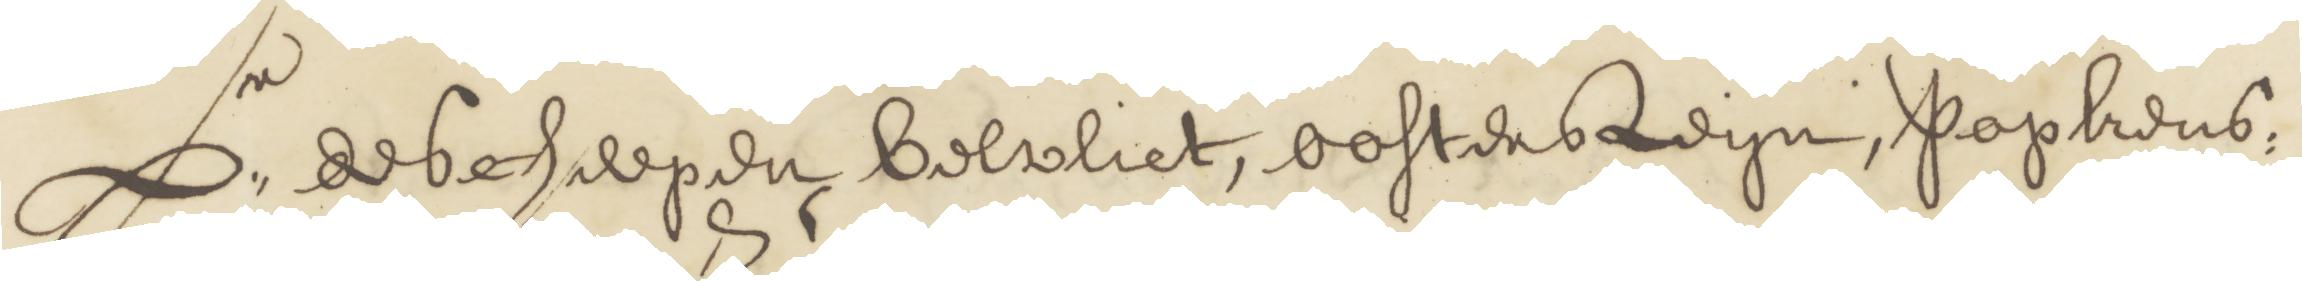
p„r de scheepen belvliet, oostersteijn, popkens„
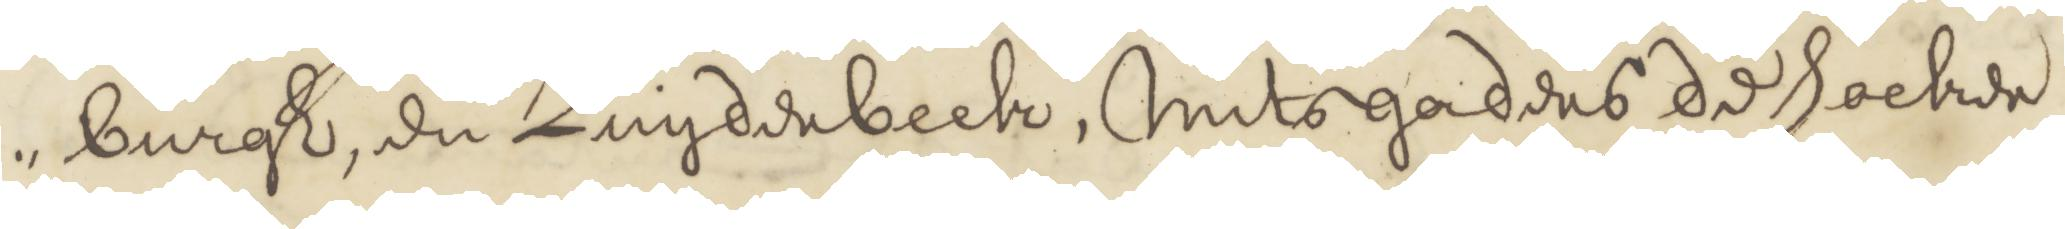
„burgh, en zuijderbeek, mitsgaders de hoeker
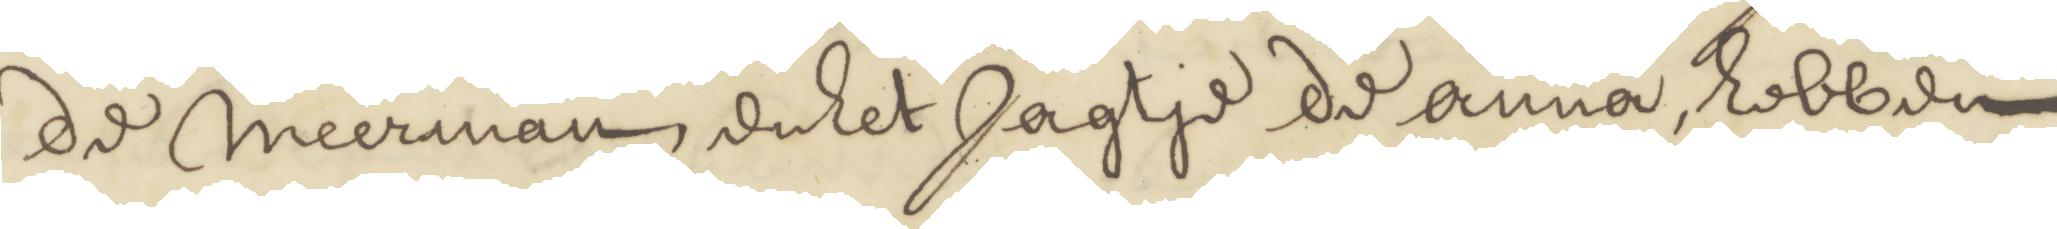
de meerman, en het Jagtje de anna, hebben
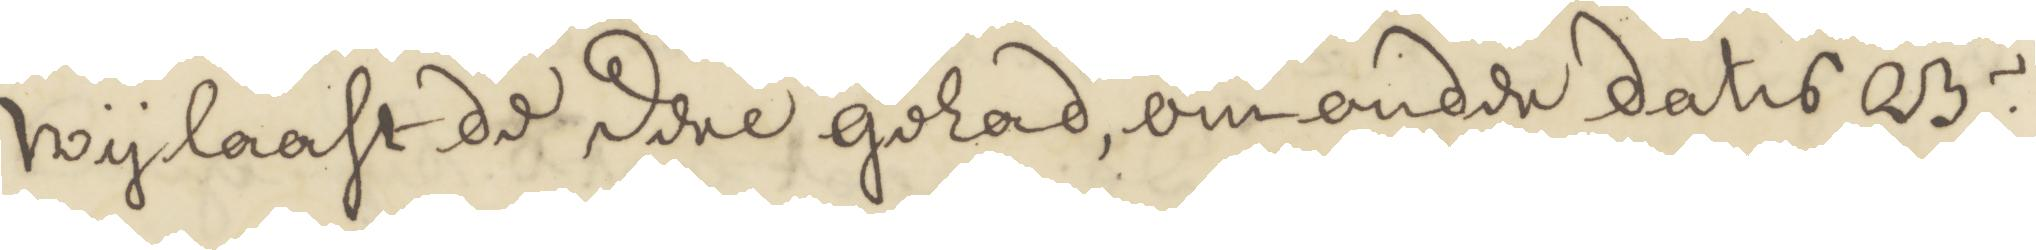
wij laast de Eere gehad, om onder datis 23.'
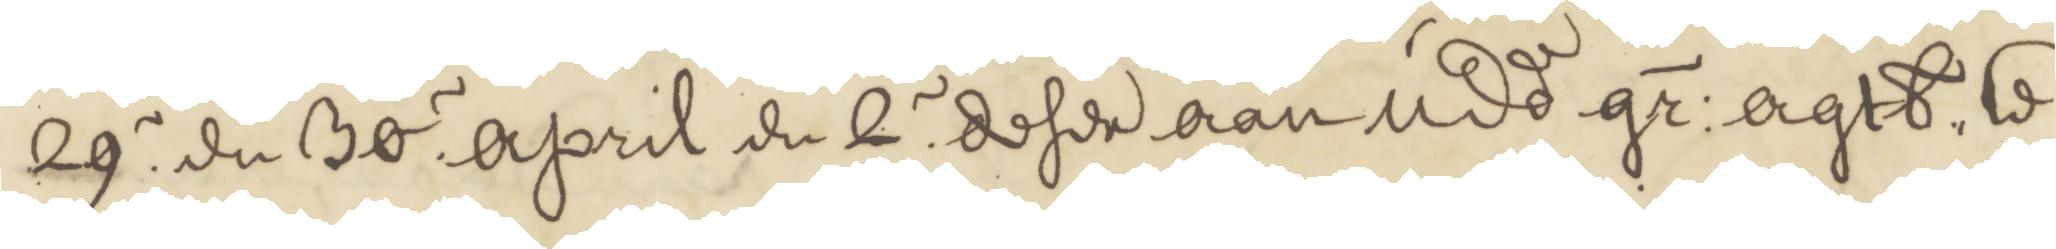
29.' en 30.' april en 2.' deser aan uEd gr: agtb„ te
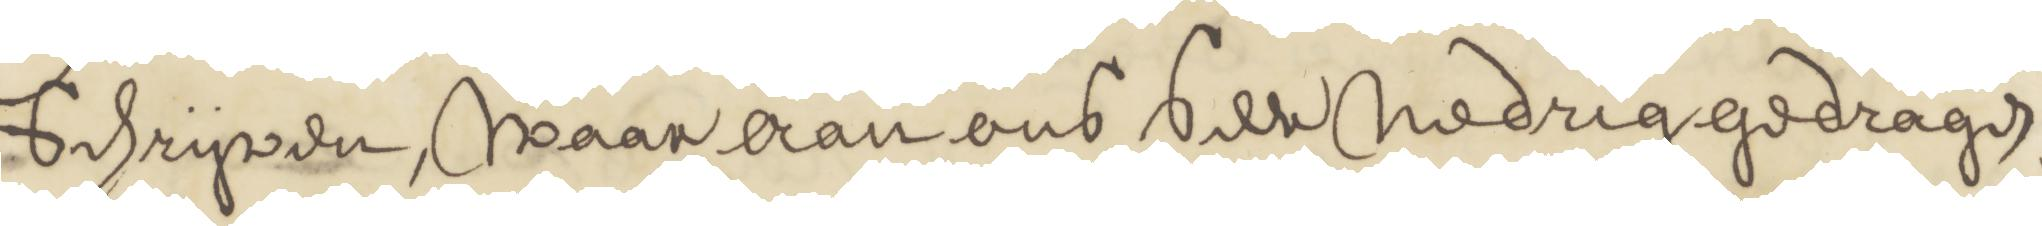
schrijven, waar aan ons seer nedrig gedragen
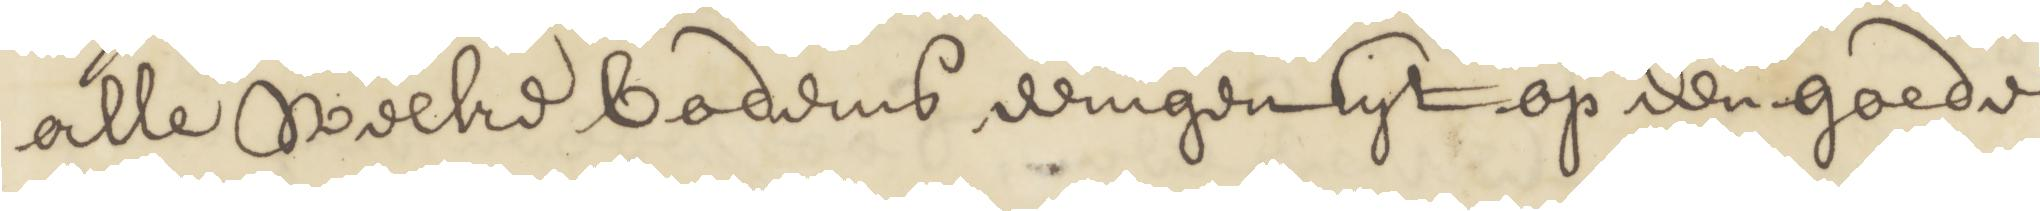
alle welke bodems, eenigen tijt op Een goede
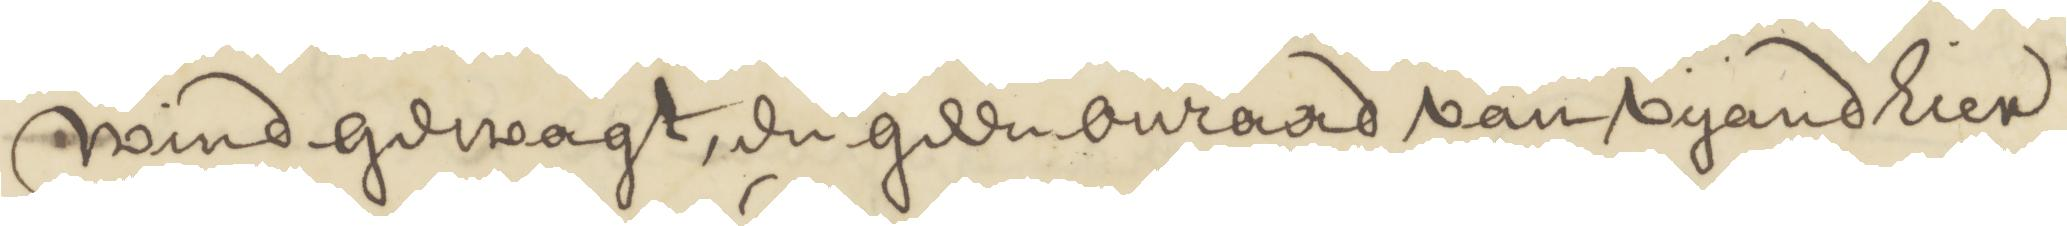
wind gewagt, en geen onraad van vijand hier
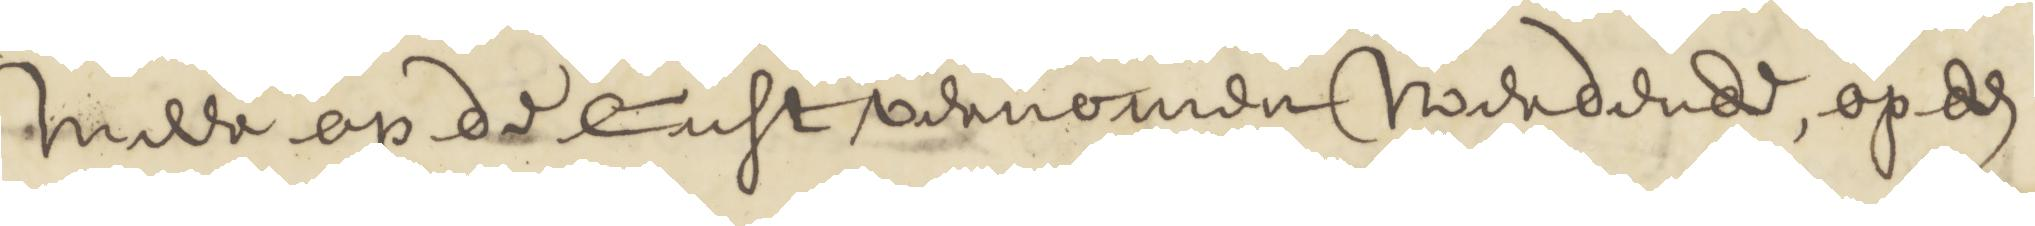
meer op de cust vernomen werdende, op den
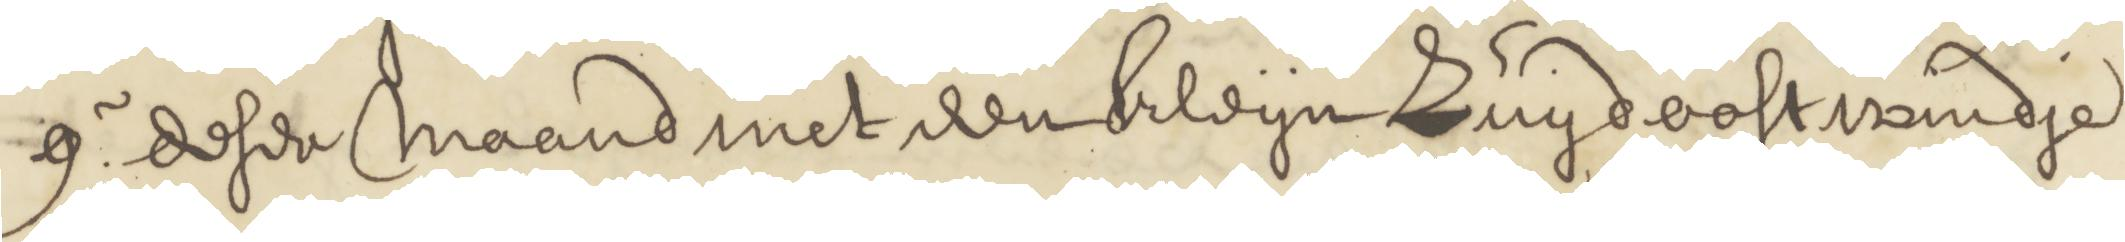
9.' deser maand met een kleijn zuijd oost windje
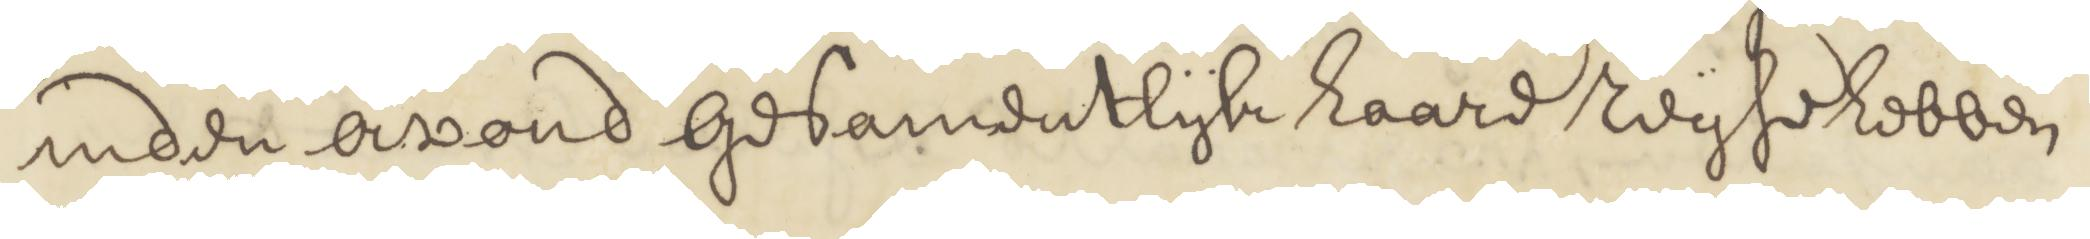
inden avond gesamentlijk haare reijse hebben
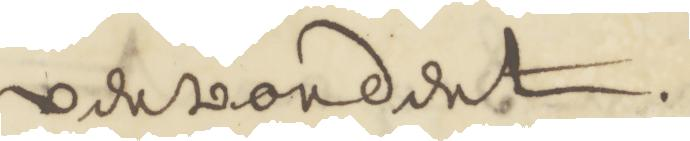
vervordert.
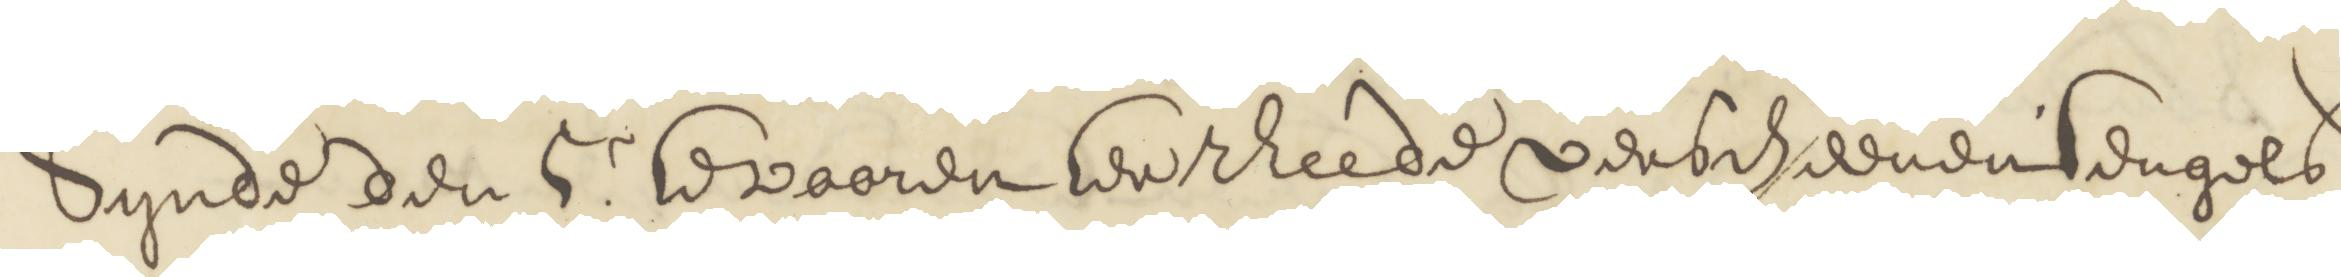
Synde den 5.' tevooren ter rheede verscheenen ’t engels
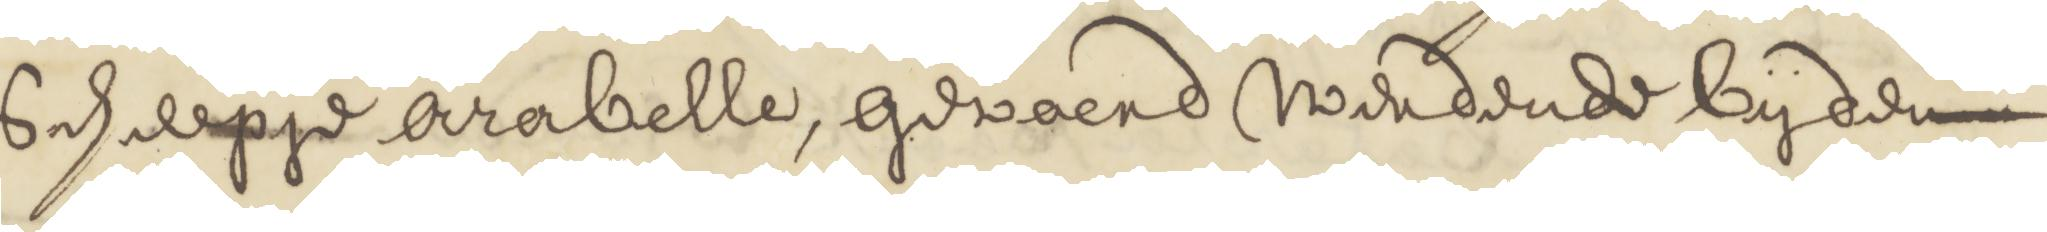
scheepje arabelle, gevoerd werdende bij den
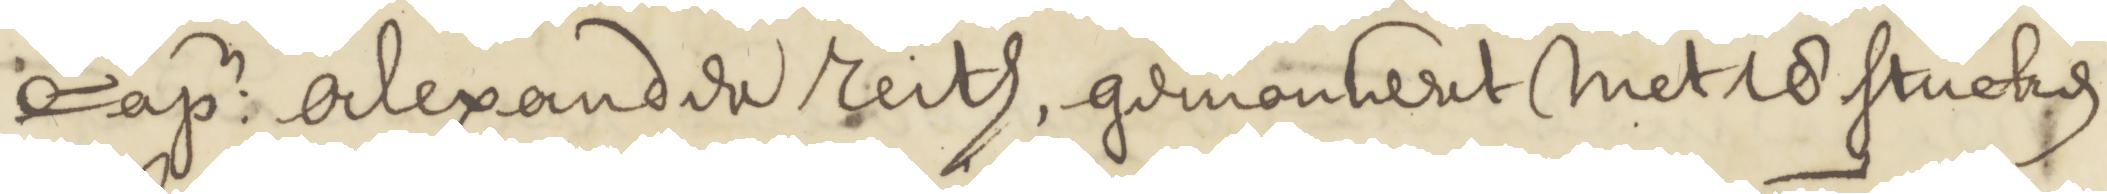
cap:n alexander reith, gemonteert met 18 stucken
